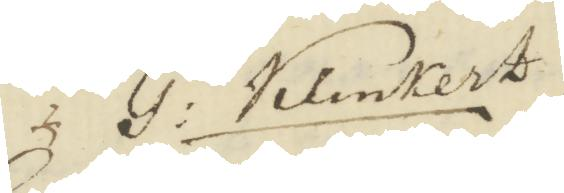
G: Klinkert
